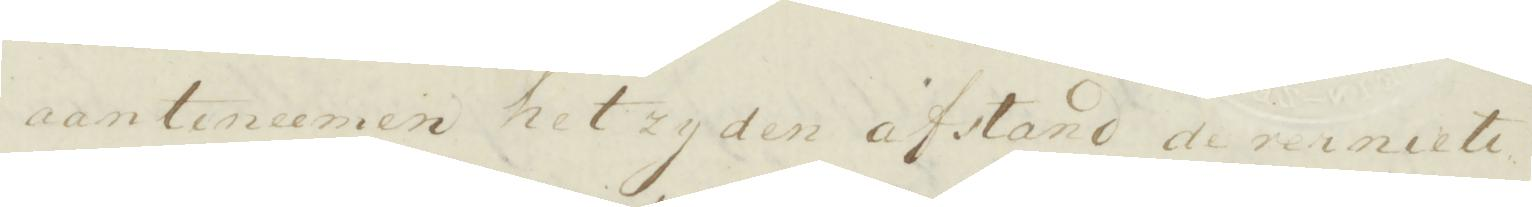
aan teneemen het zy den afstand de vernieti„
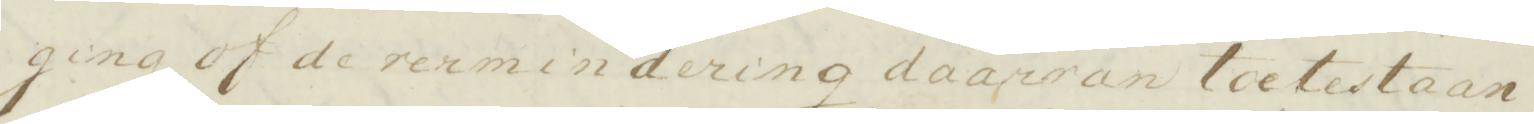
ging of de vermindering daarvan toe testaan
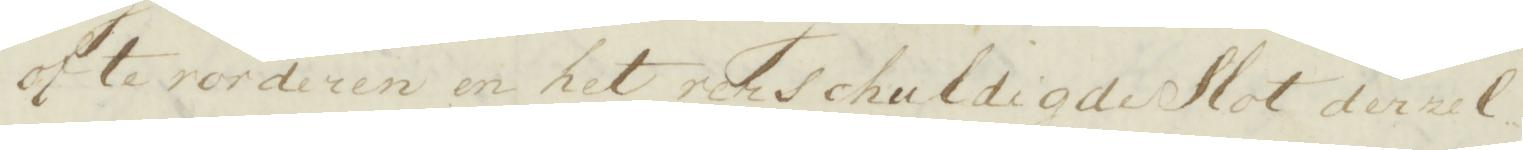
of te vorderen en het verschuldigde slot derzel„
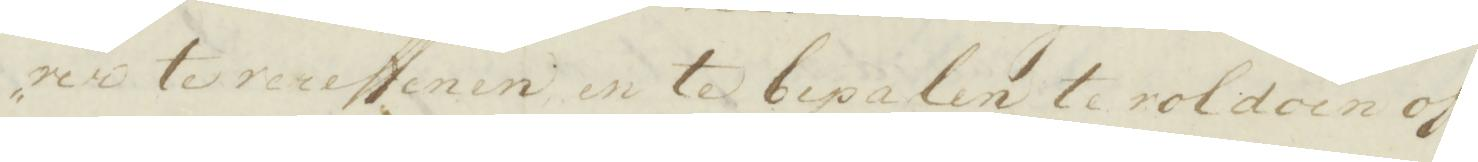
„ver te vereffenen, en te bepalen te voldoen of
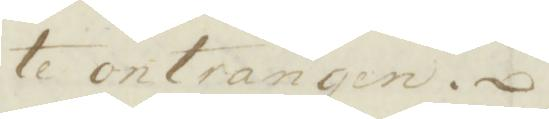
te ontvangen.—
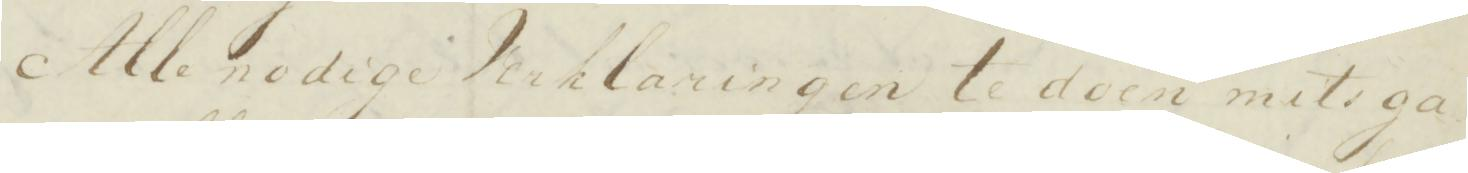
Alle nodige Verklaringen te doen mitsga„
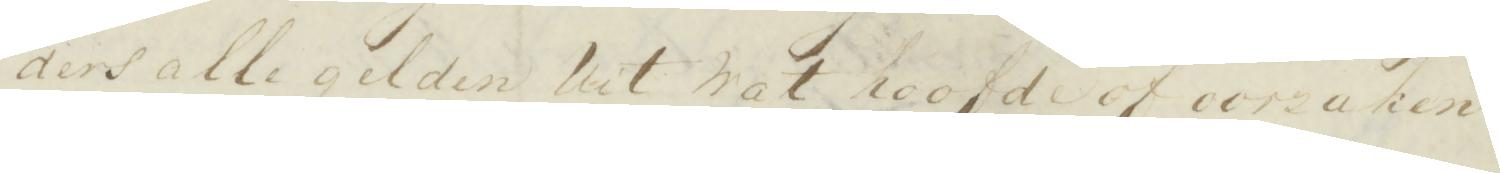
ders alle gelden uit wat hoofde of oorzaken
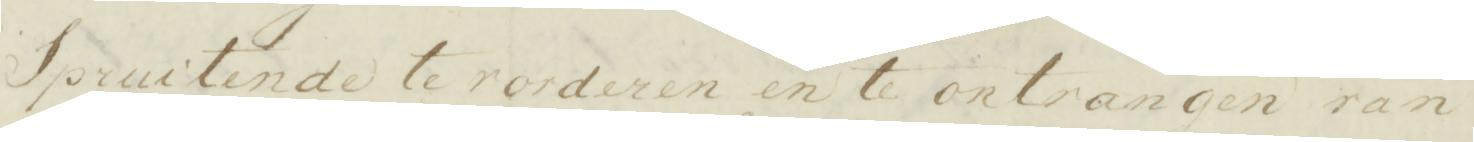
spruitende te vorderen en te ontvangen van
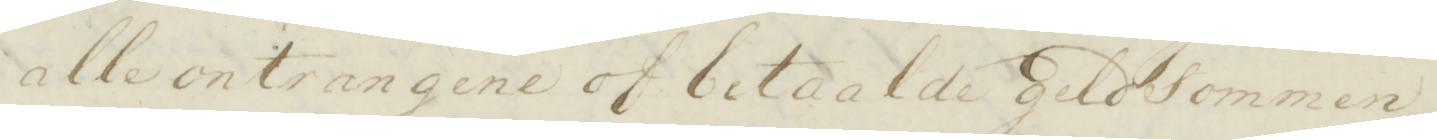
alle ontvangene of betaalde geld sommen
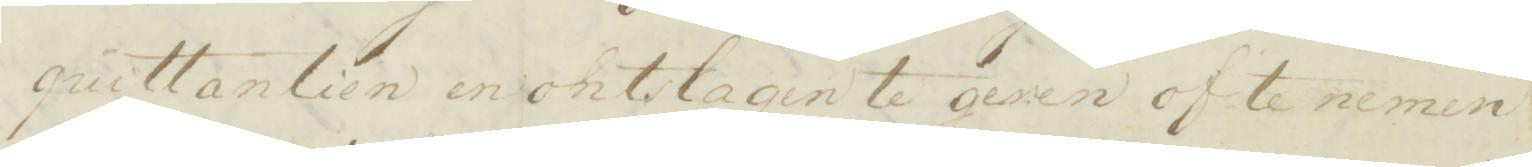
quittantien en ontslagen te geven of te nemen
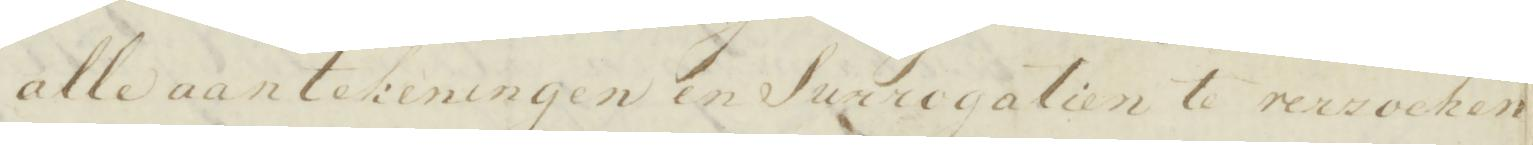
alle aantekeningen en surrogatien te verzoeken
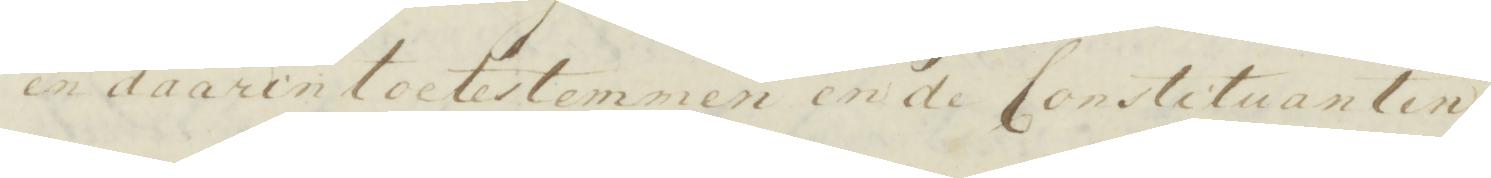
en daarin toe testemmen en de Constituanten
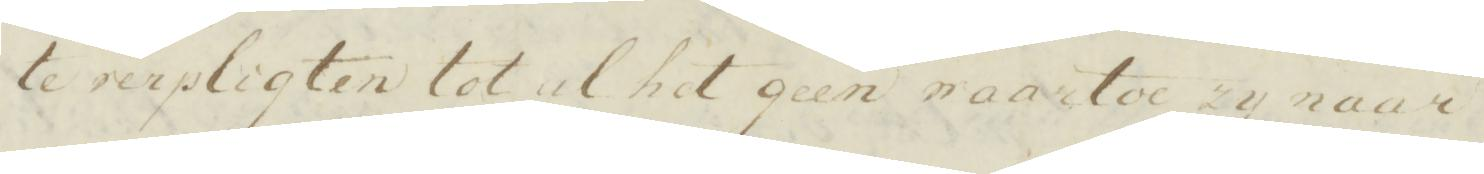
te verpligten tot al het geen waartoe zy naar
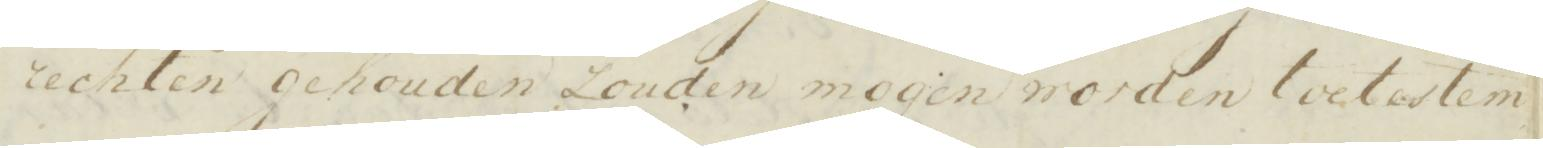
rechten gehouden zouden mogen worden toetestem
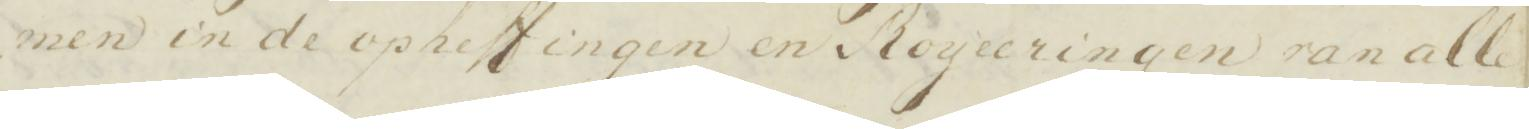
„men in de opheffingen en Royeeringen van alle
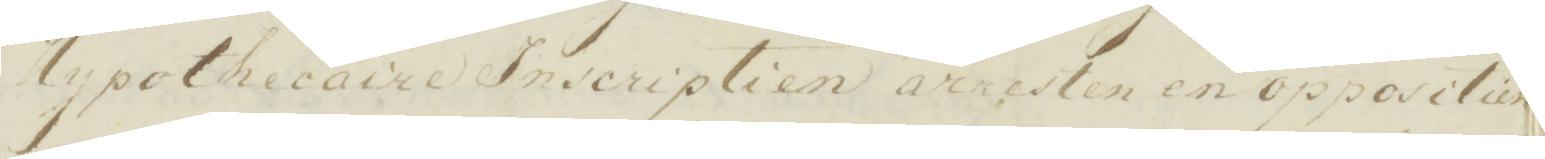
Hypothecaire Inscriptien arresten en oppositien
